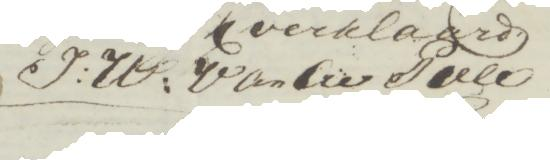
J: W: Van Lier Poele
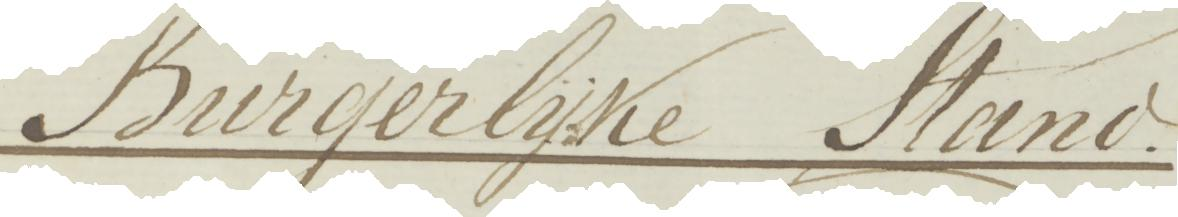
Burgerlijke stand.
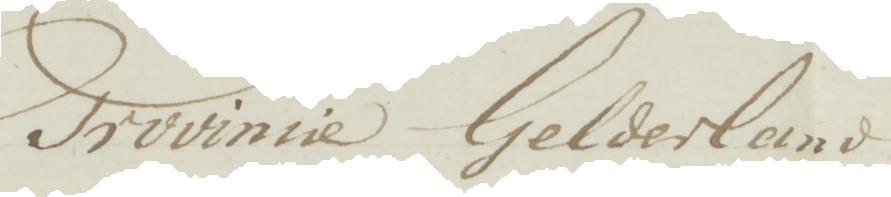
Provincie Gelderland
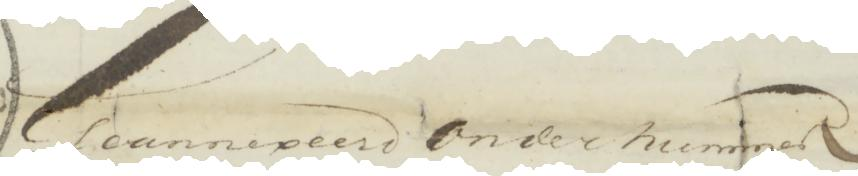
Geannexeerd onder nummer
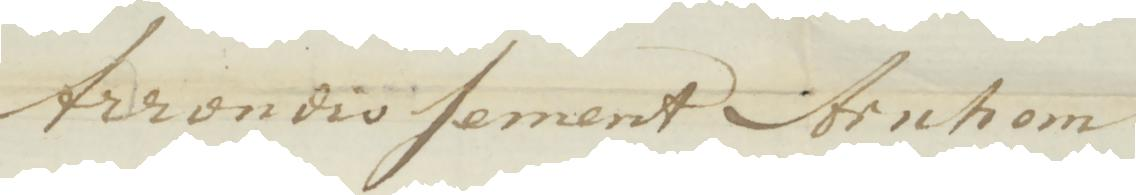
Arrondissement Arnhem
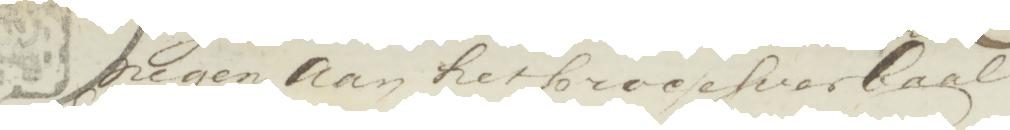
negen aan het procesverbaal
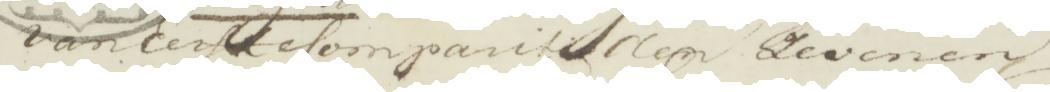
van Eerste Comparitie den Zevenen
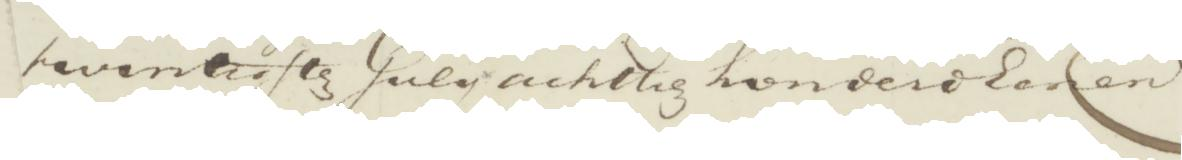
twintigste Julij achttien honderd Een en
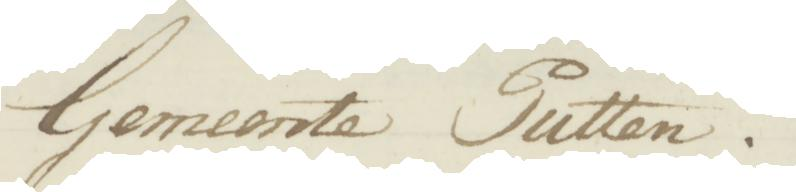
Gemeente Putten.
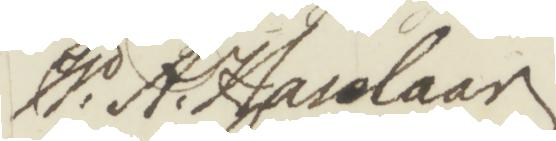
W:A:Haselaar
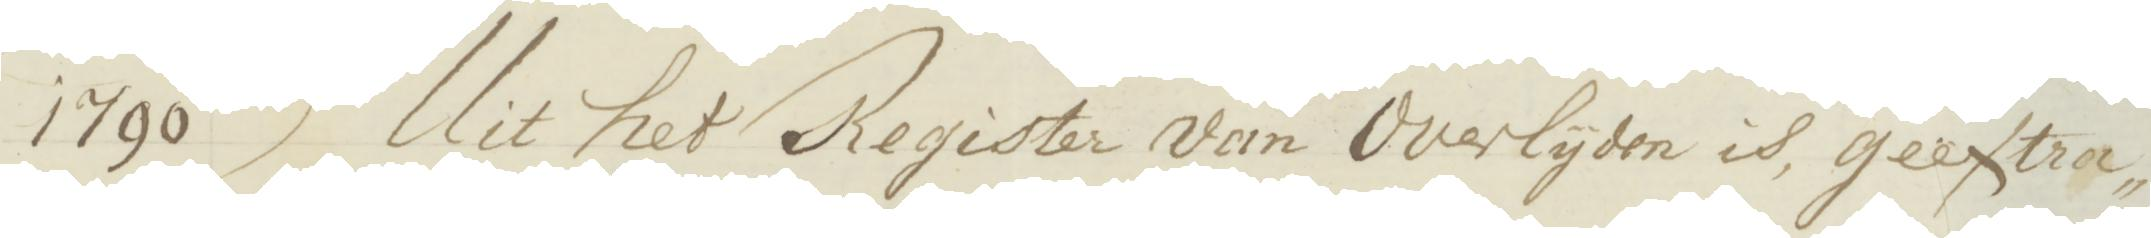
1790 Uit het Register van Overlijden is, geextra„
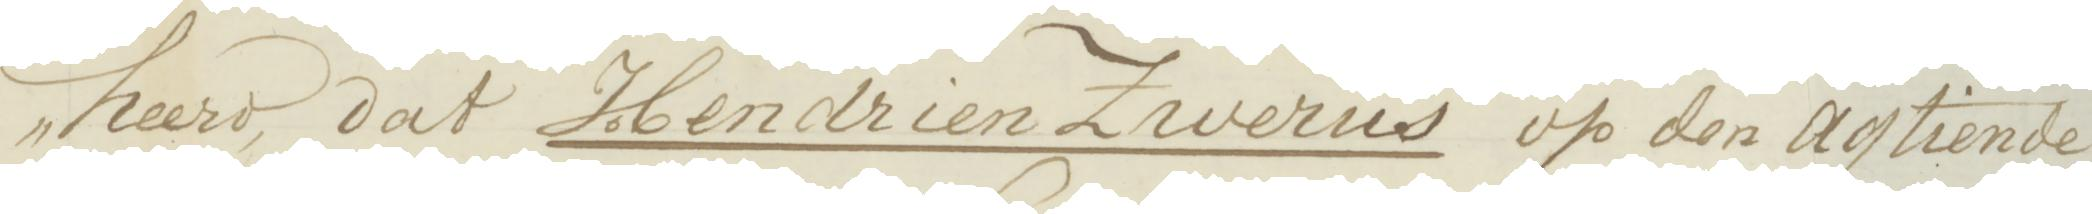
„heerd, dat Hendrien Zwerus op den agtiende
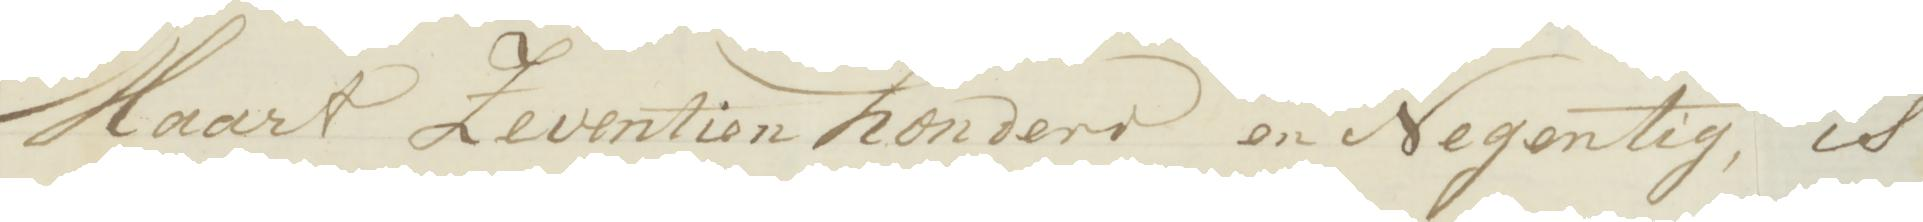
Maart Zeventien honderd en Negentig, is
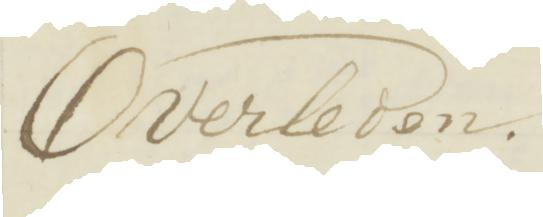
Overleden.
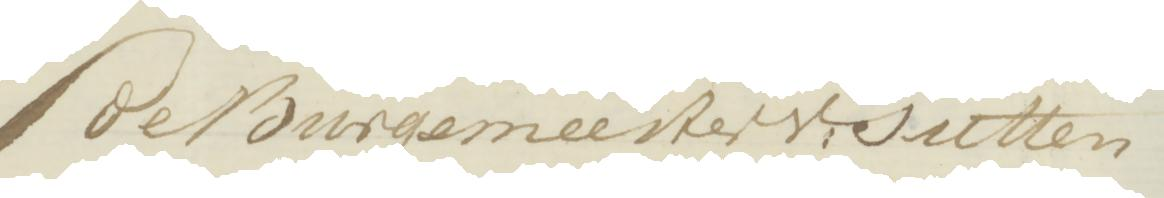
de Burgemeester v: Putten
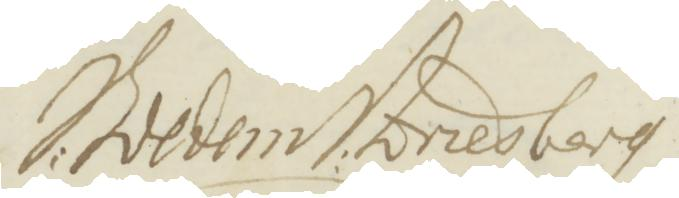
V:Dedem Driesberg
